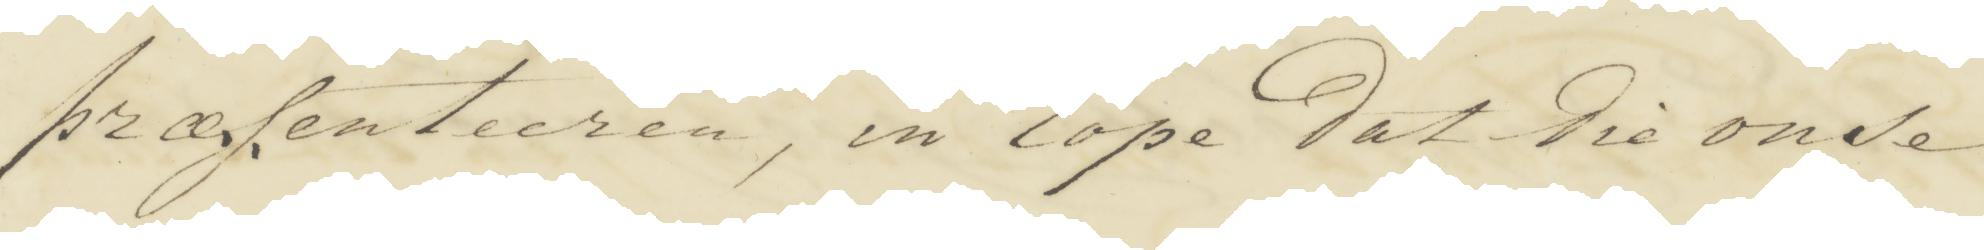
praesenteeren, in hope dat die onse
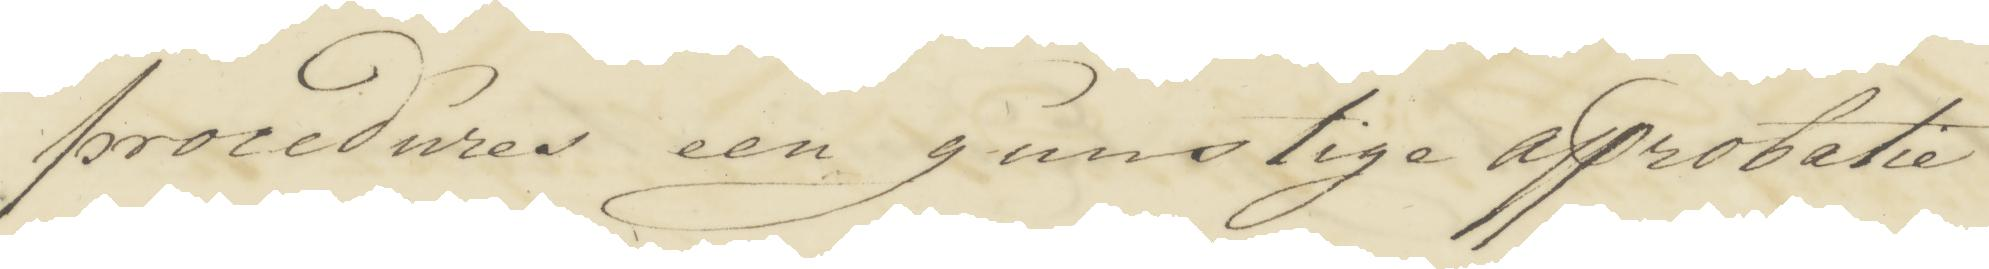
procedures een gunstige approbatie
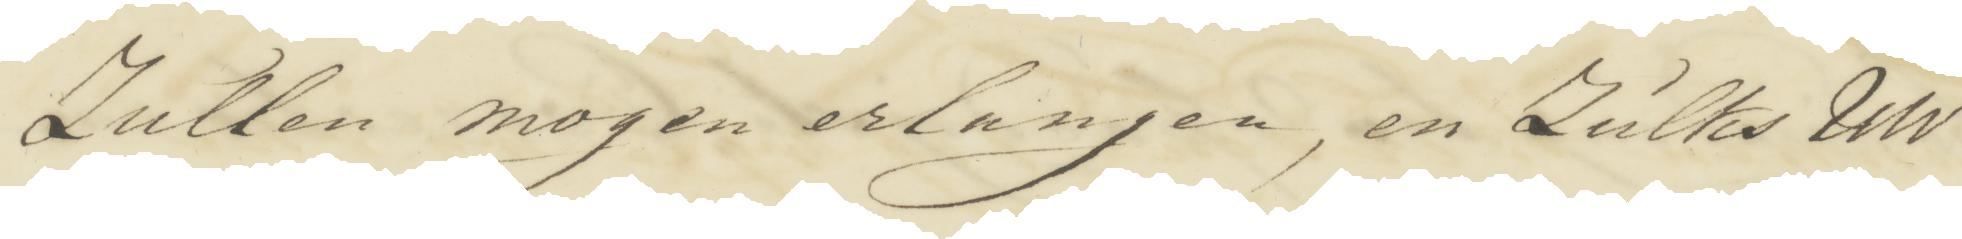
Zullen mogen erlangen en zulks UW
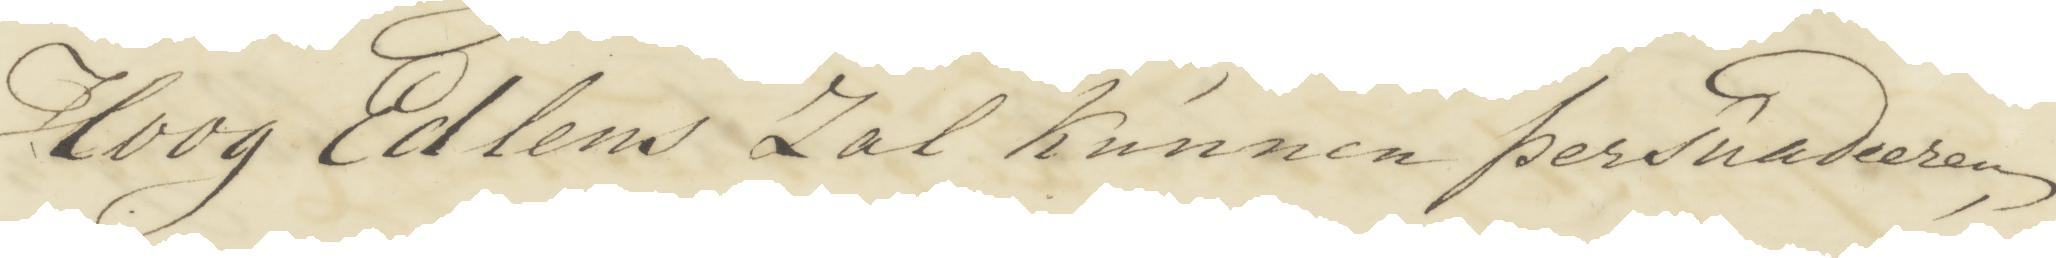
Hoog Edlens Zal kunnen persuadeeren,
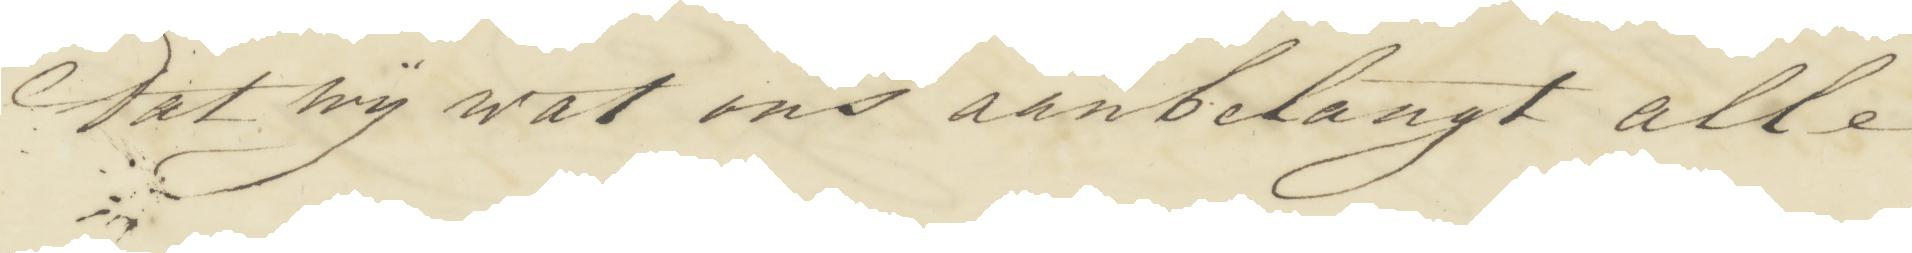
dat wij wat ons aanbelangt alle
